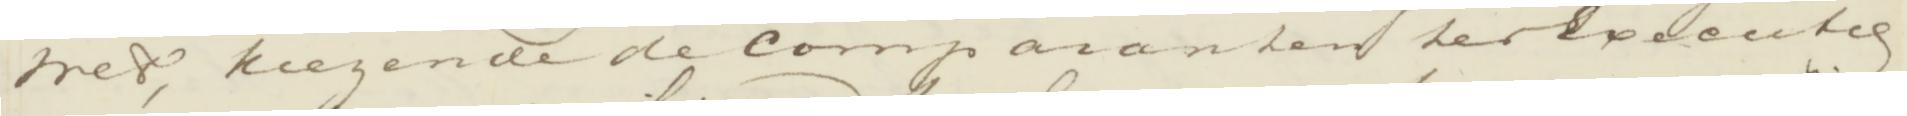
wet, kiezende de comparanten ter Executie
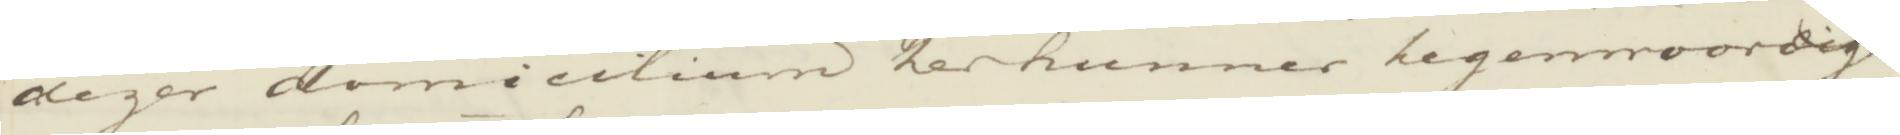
dezer domicilium ter hunner tegenwoordige
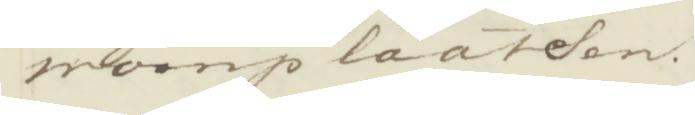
woonplaatsen.
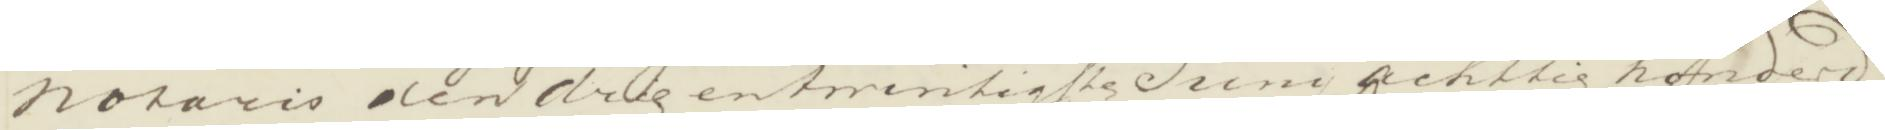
notaris den drie en twintigsten Iuny achttien honderd
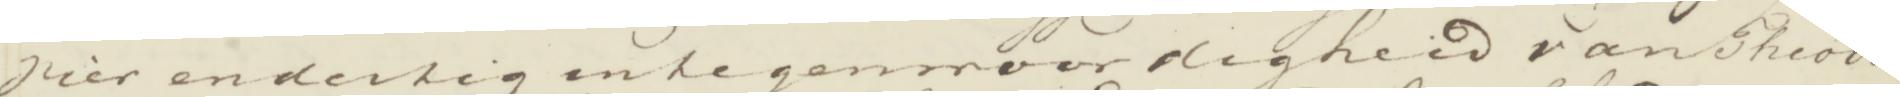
vier en dertig integenwoordigheid van Theodo
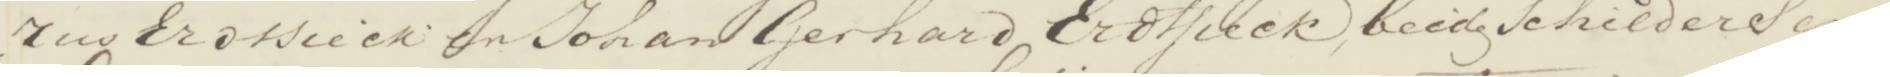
rus Erdtsieck en Iohan Gerhard Erdtsieck, beide schilders en
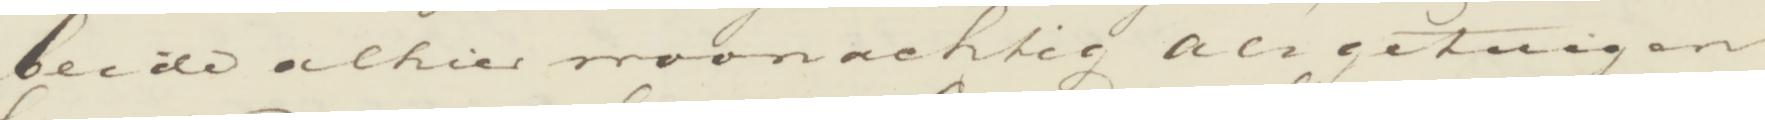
beide alhier woonachtig als getuigen
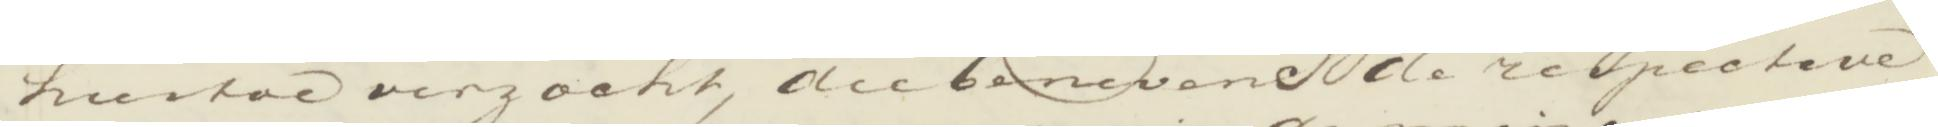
hiertoe verzocht, die benevens de respective
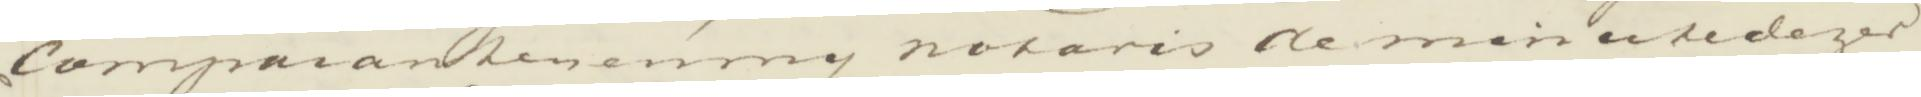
comparanten en my notaris de minute dezer
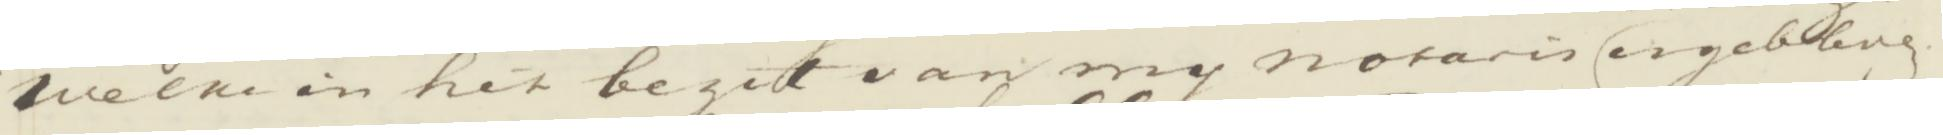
welke in het bezit van my notaris is gebleven
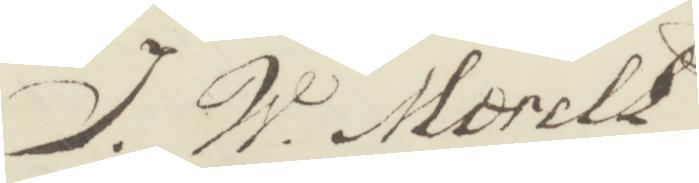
I. W. Morels
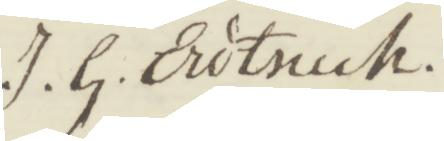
J. G. Erdtsieck.
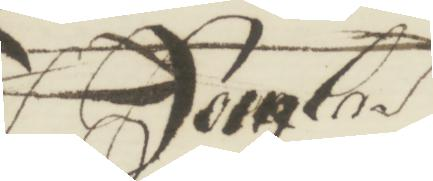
J Voight
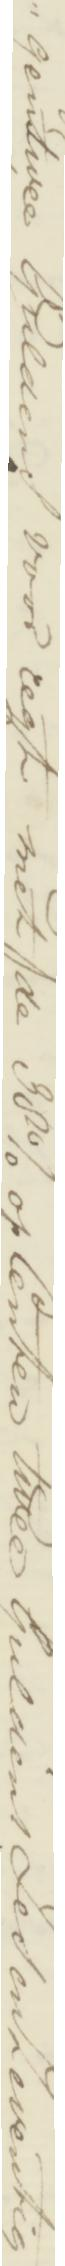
„gen twee Guldens voor regt met de 38% opcenten, twee Guldens Zes en Zeventig
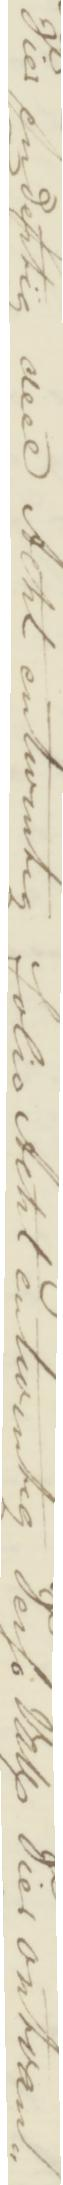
Vier en dertig deel Acht en twintig folio Acht en twintig Verso Vak Vier ontvan„
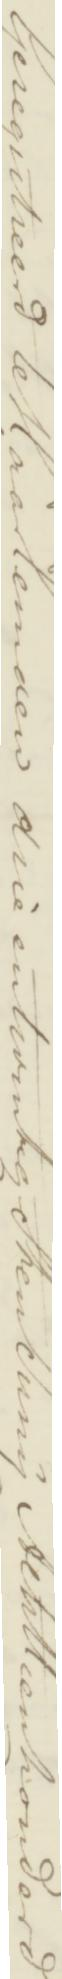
Geregistreerd te Haarlem den drie en twintigsten Iunij Achttienhonderd
